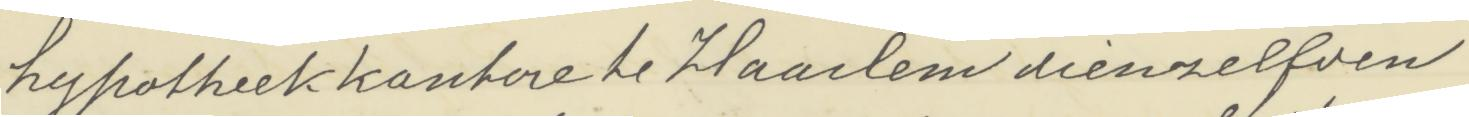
hypotheek kantore te Haarlem dienzelfven
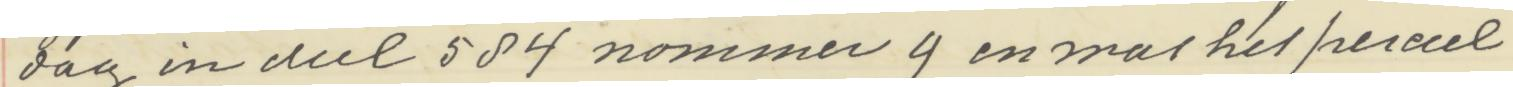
dag in deel 584 nommer 4 en was het perceel
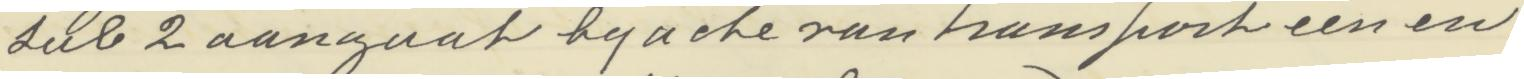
sub 2 aangaat by acte van transport een en
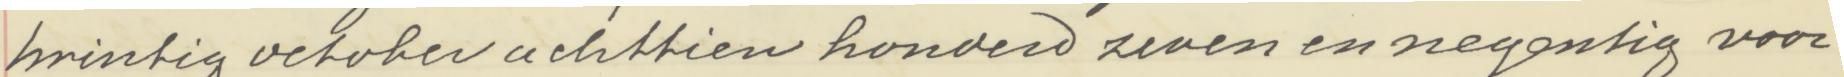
twintig october achttien honderd zeven en negentig voor
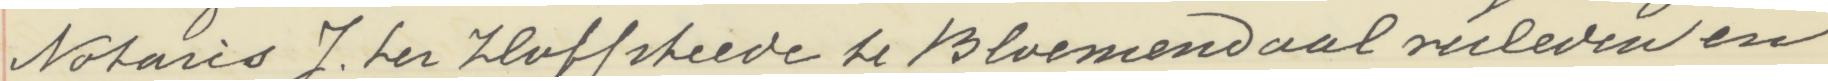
Notaris J. ter Hoffsteede te Bloemendaal verleden en
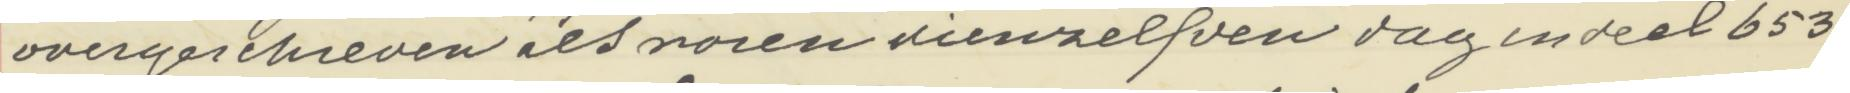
overgeschreven als voren dienzelfven dag in deel 653
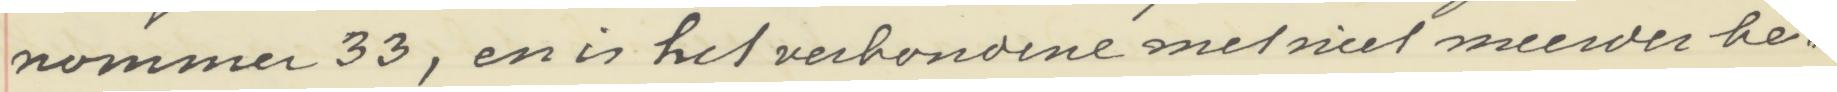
nommer 33, en is het verbondene met niet meerder be„
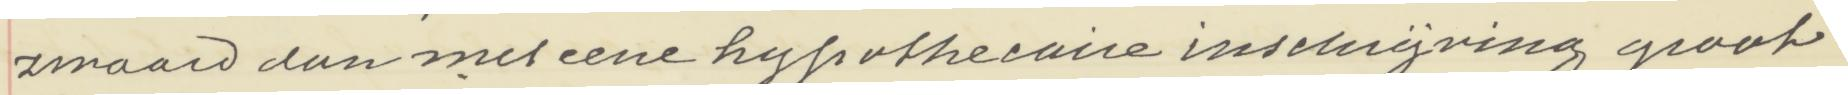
zwaard dan met eene hypothecaire inschrijving groot
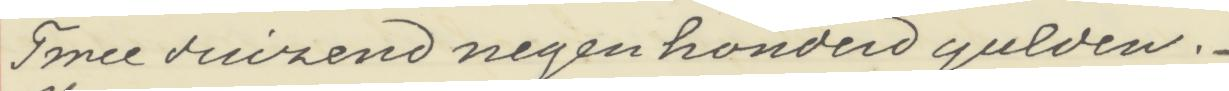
Twee duizend negen honderd gulden.
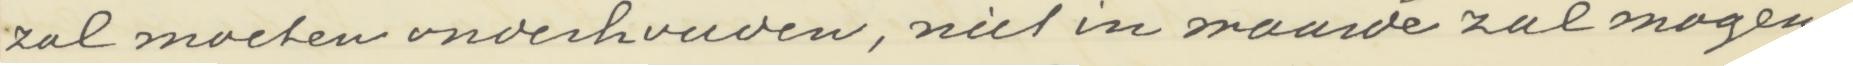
zal moeten onderhouden, niet in waarde zal mogen
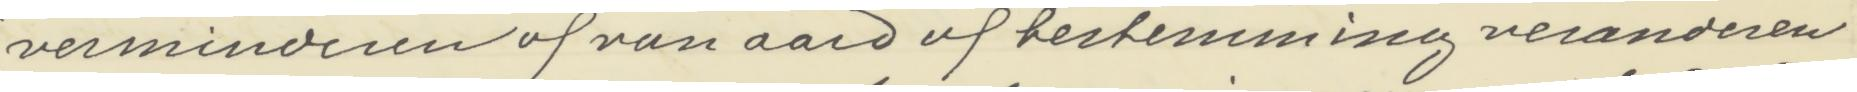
verminderen of van aard of bestemming veranderen
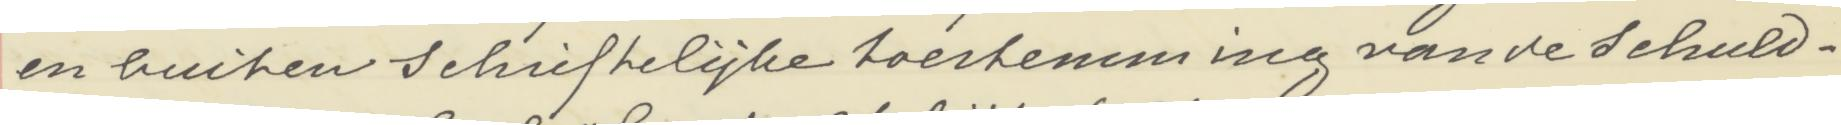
en buiten schriftelijke toestemming van de schuld-
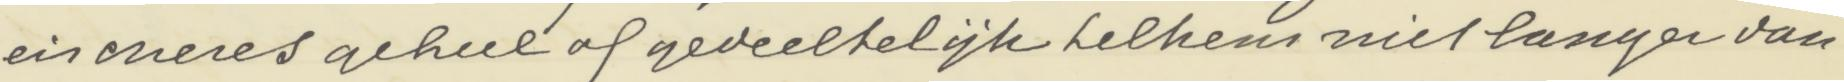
eischeres geheel of gedeeltelijk telkens niet langer dan
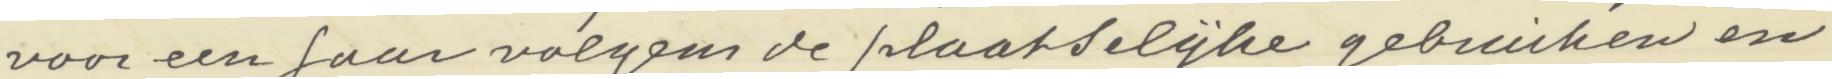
voor een jaar volgens de plaatselijke gebruiken en
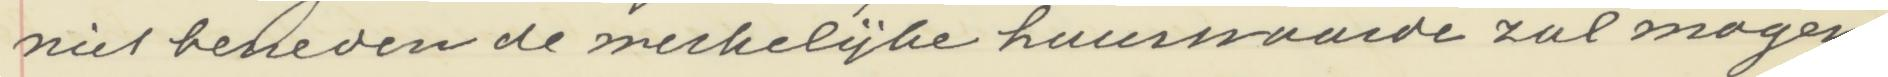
niet beneven de werkelijke huurwaarde zal mogen
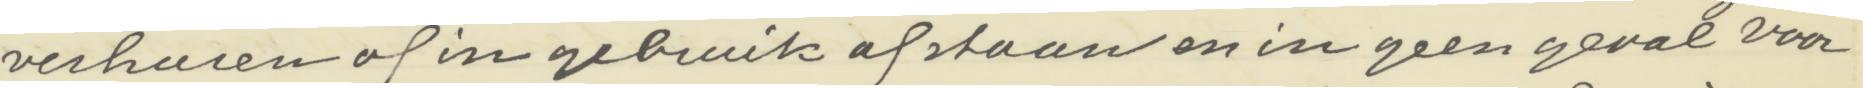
verhuren of in gebruik afstaan en in geen geval voor
